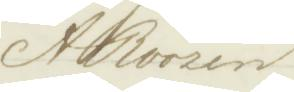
A Roozen
